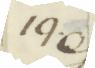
19.
